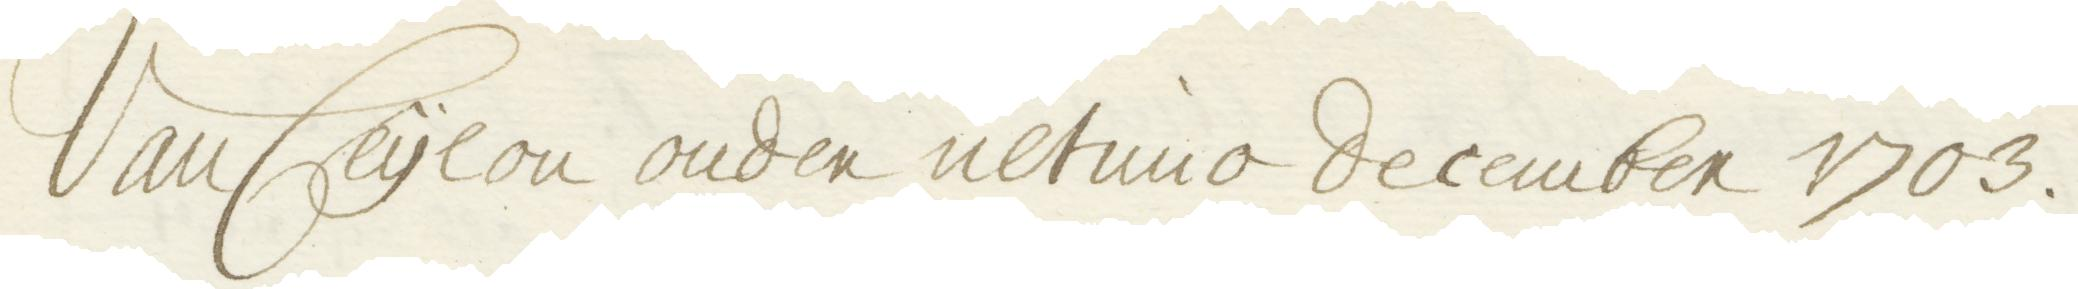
Van Ceijlon onder ultimo december 1703.
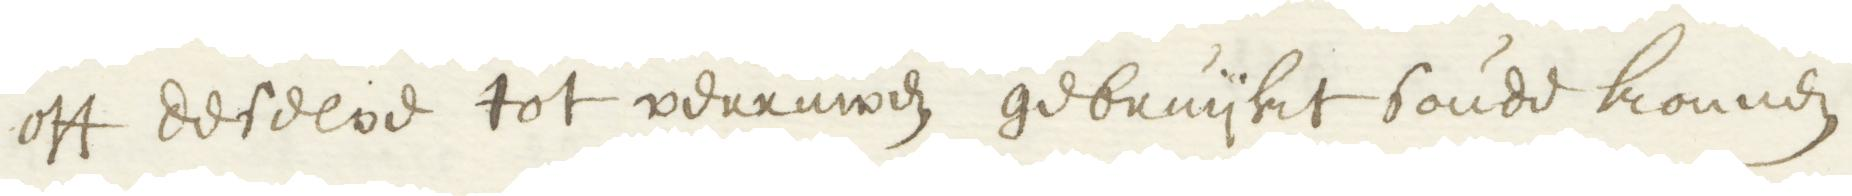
off deselve tot verruwen gebruijkt soude konnen
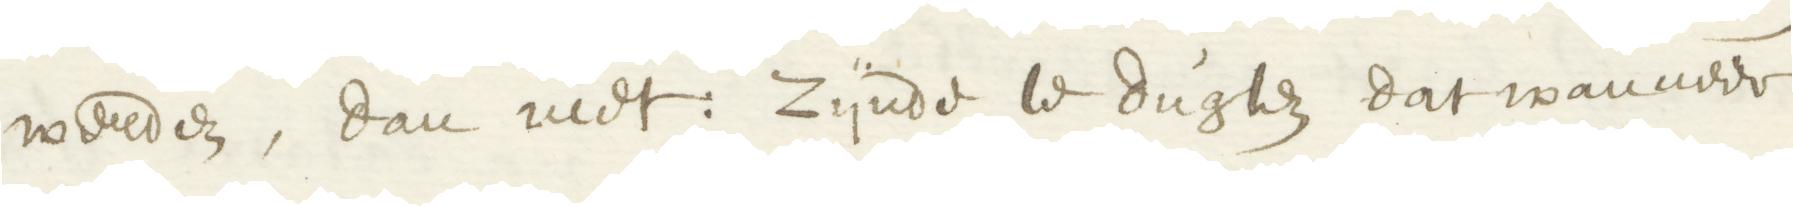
werden, dan niet: zijnde te dugten dat wanneer
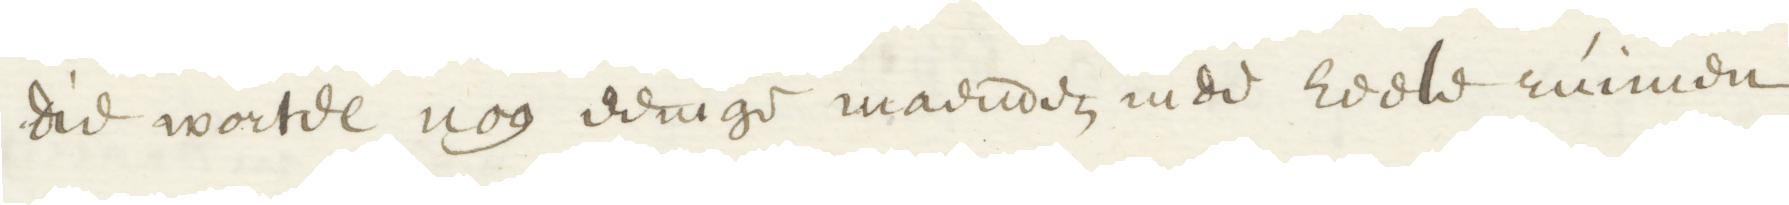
die wortel nog eenige maenden in de heete ruimen
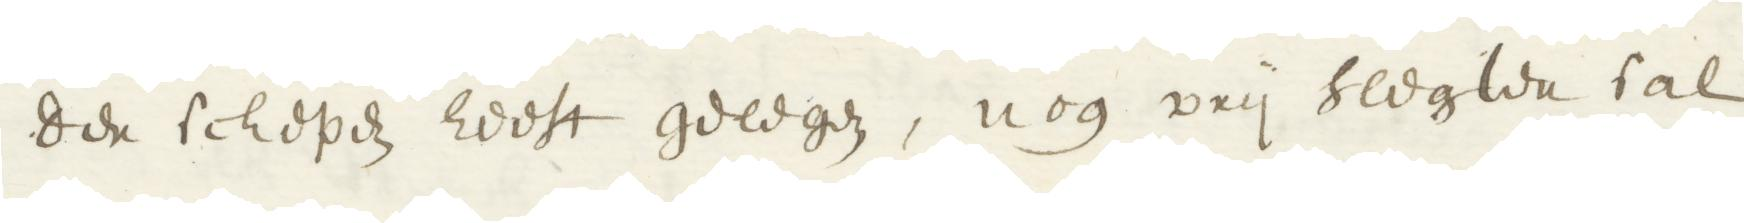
der schepen heeft gelegen, nog vrij slegter sal
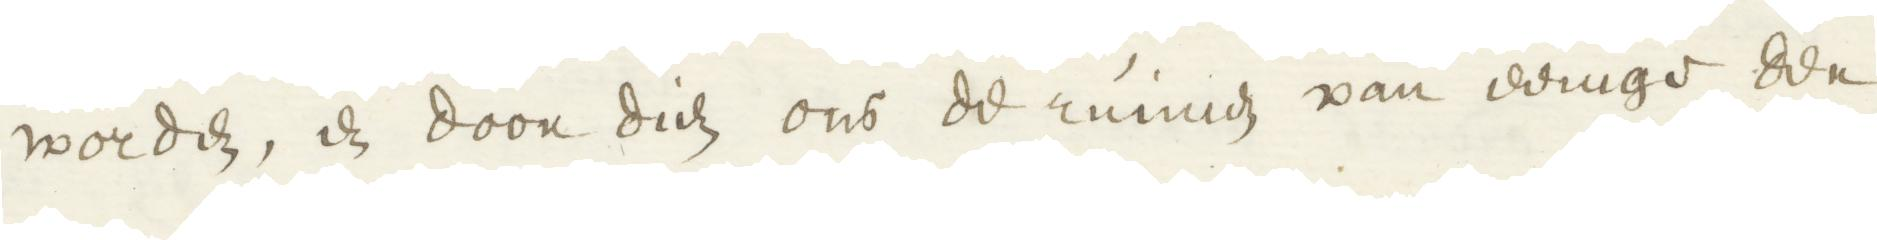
worden, en door dien ons de ruimen van eenige der
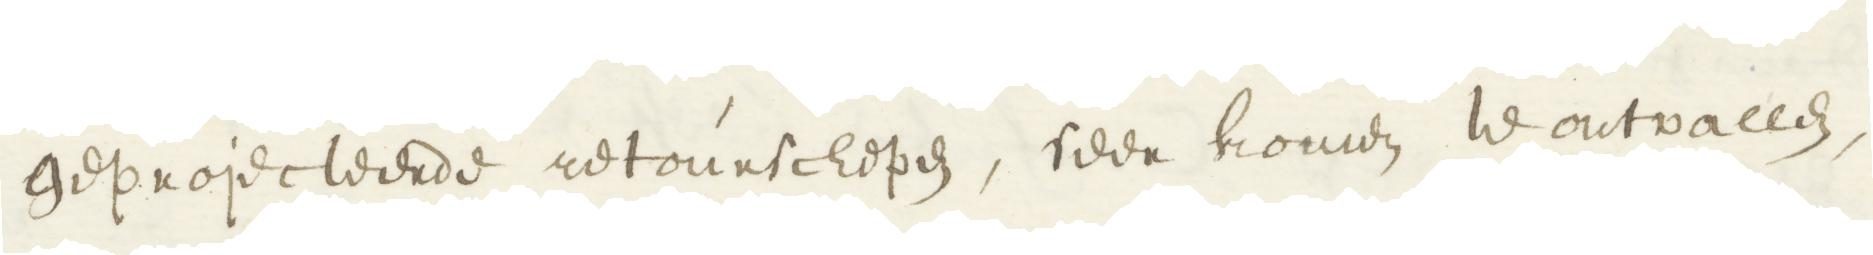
geprojecteerde retourschepen, seer komen te ontvallen,
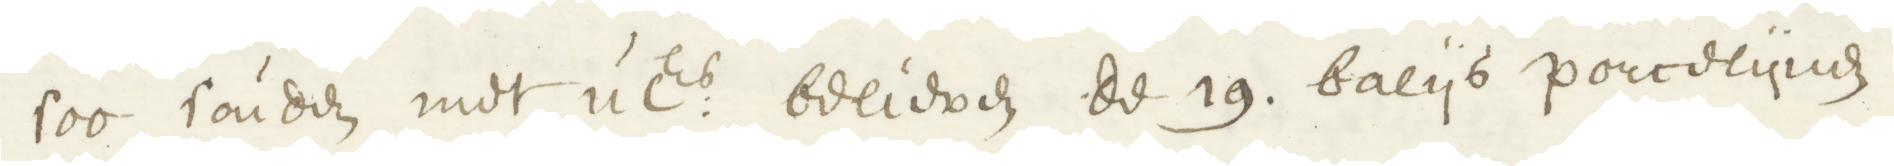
soo souden met uE:s believen de 19. balijs porcelijnen
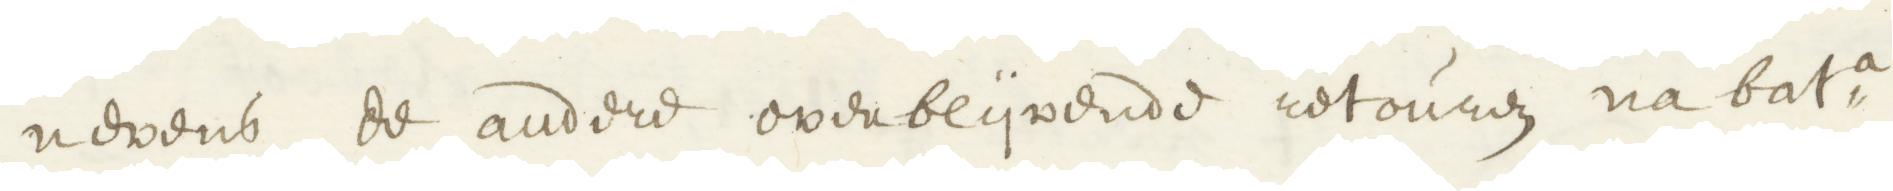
nevens de andere overblijvende retouren na bat„a
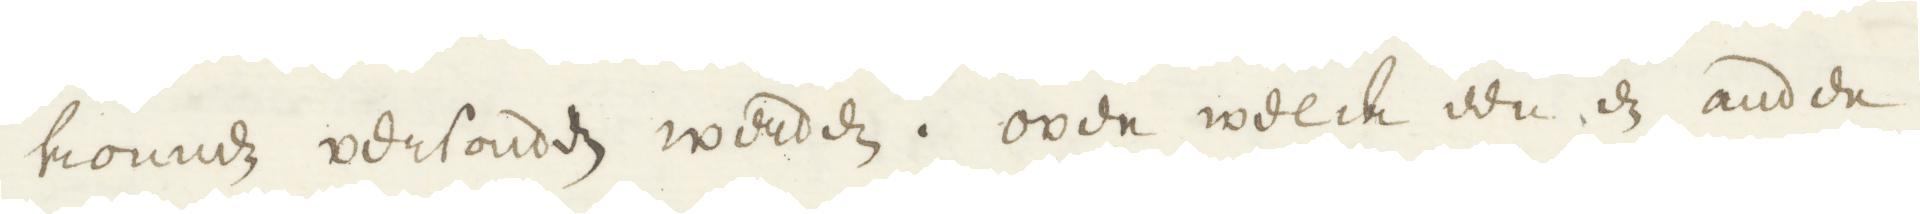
konnen versonden werden. over welck een en ander
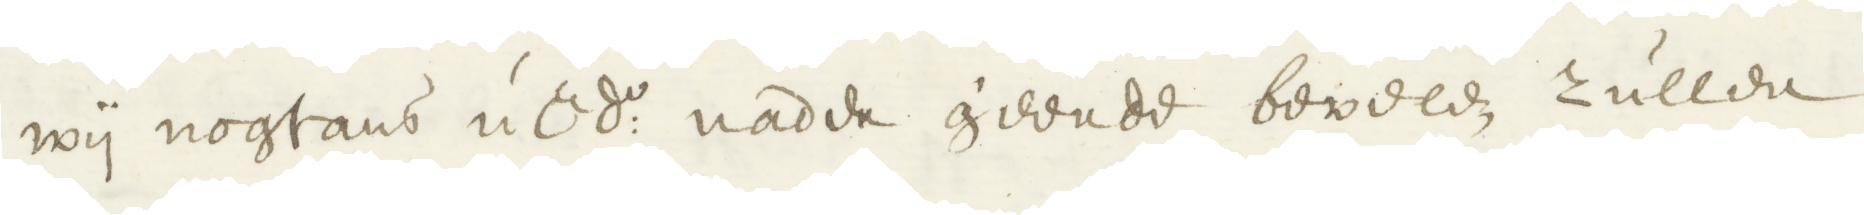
wij nogtans uEd:e nader g' eerde bevelen zullen
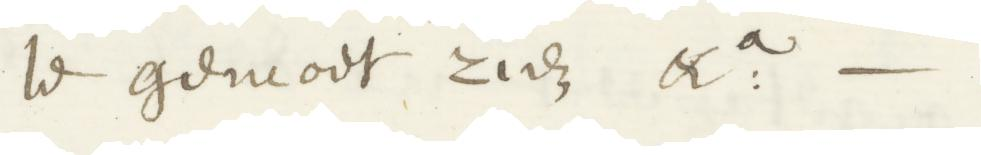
te gemoet zien &:a —
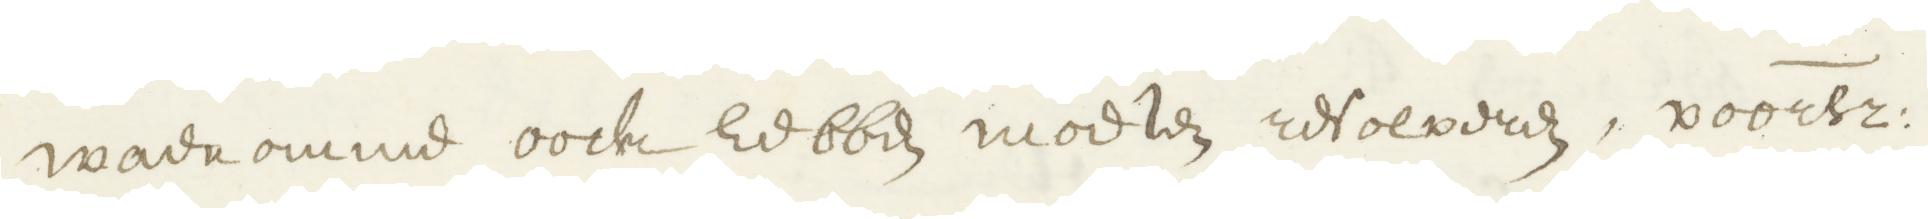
waer omme oock hebben moeten resolveren; voorsz:
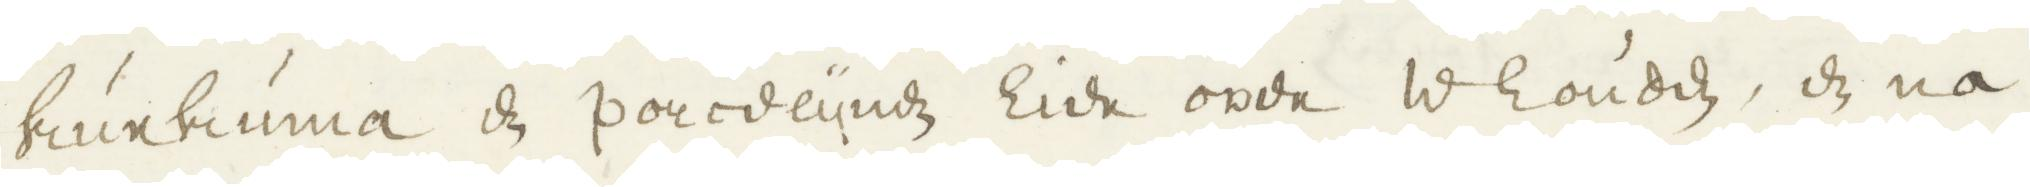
kurkuma en porcelijnen hier over te houden, en na
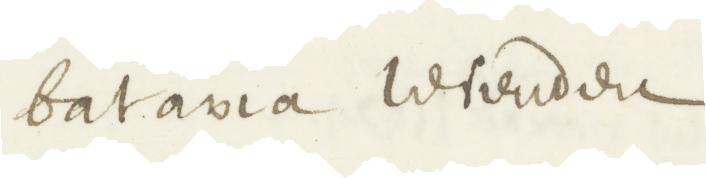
batavia tesenden
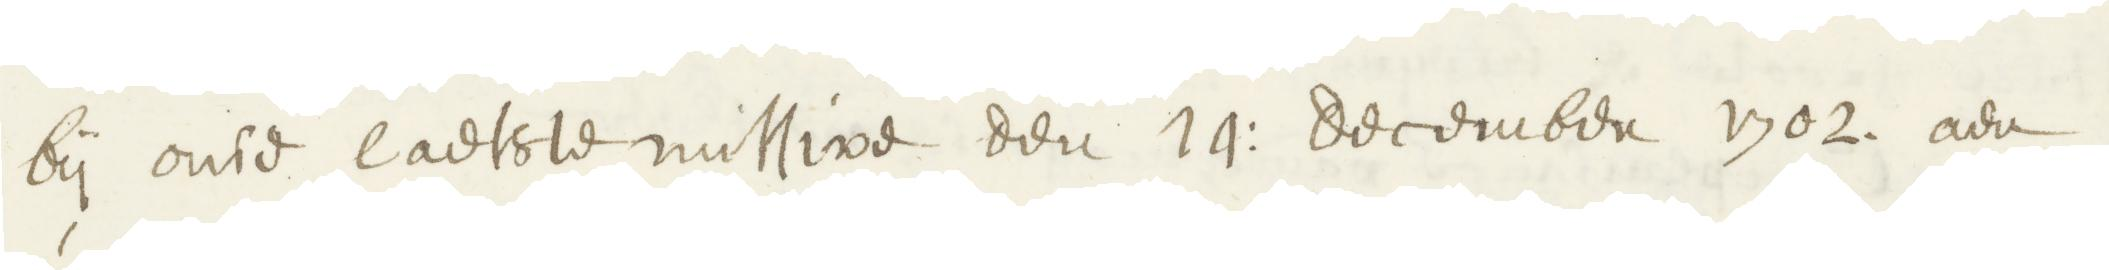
bij onse laetste missive den 14: december 1702. aen
